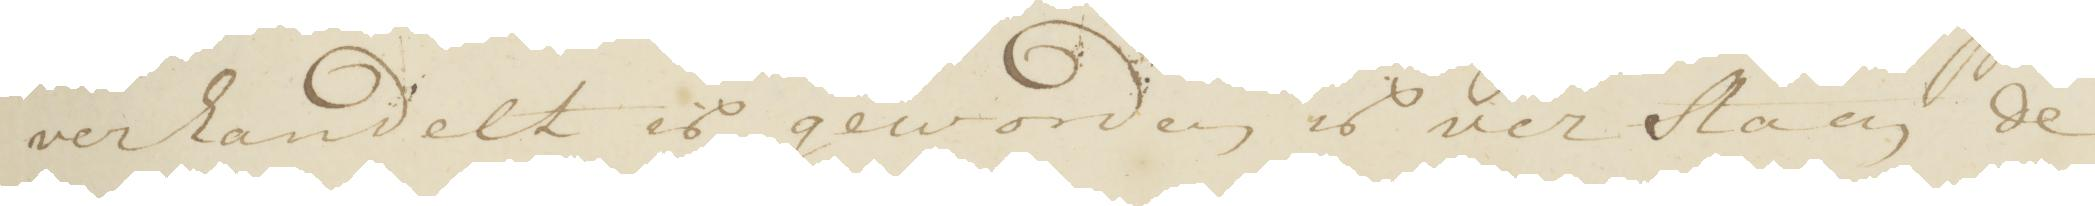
verhandelt is geworden is verstaan de
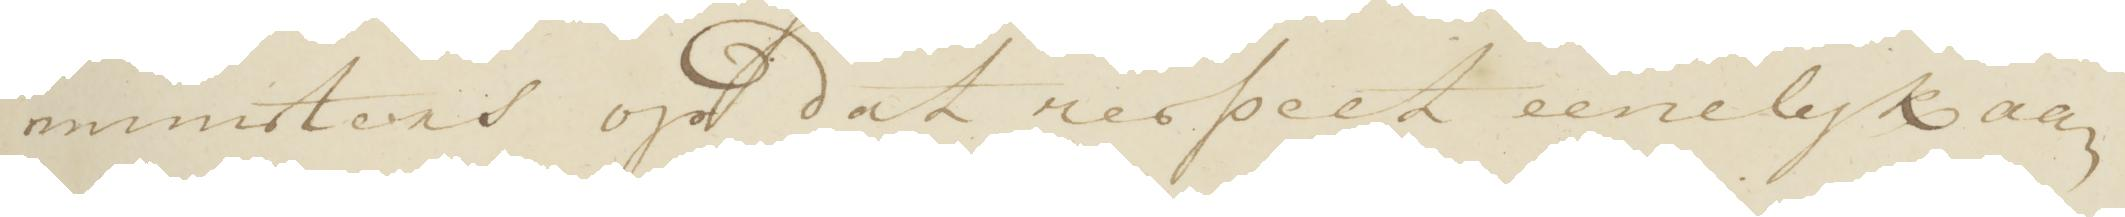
ministers op dat respect eenelijk aan
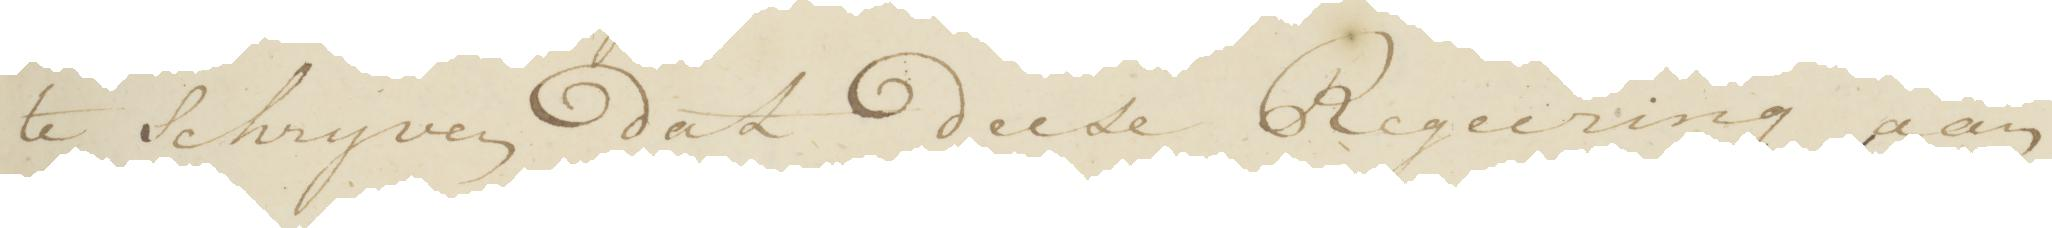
te schryven dat deese Regeering aan
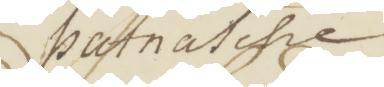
patnasche
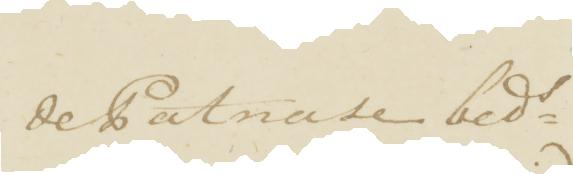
de Patnase bed=s
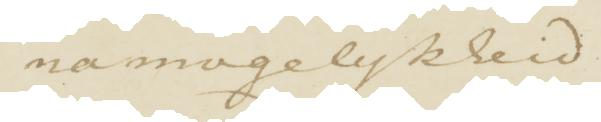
na mogelijkheid
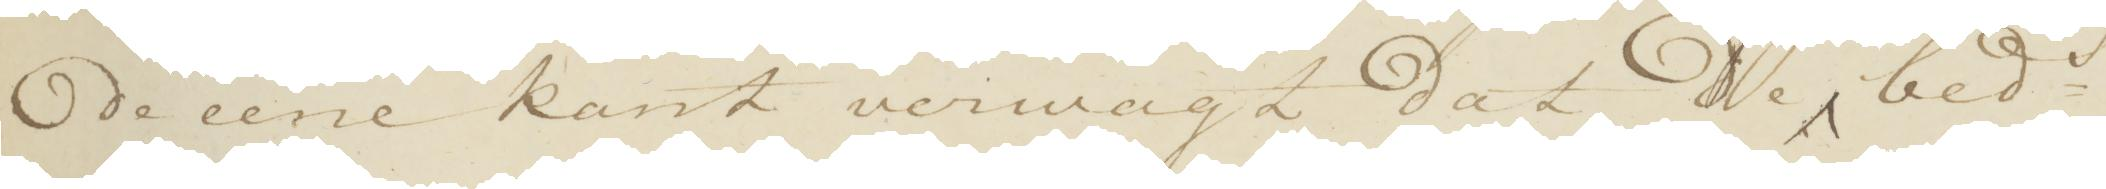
de eene kant verwagt dat de ^ bed=s
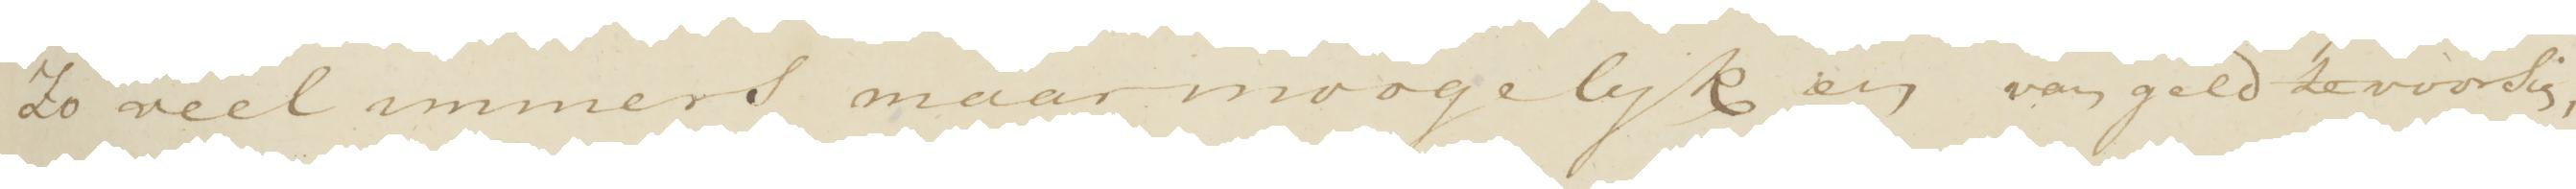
zo veel immers maar moogelijk en van geld te voorsien,
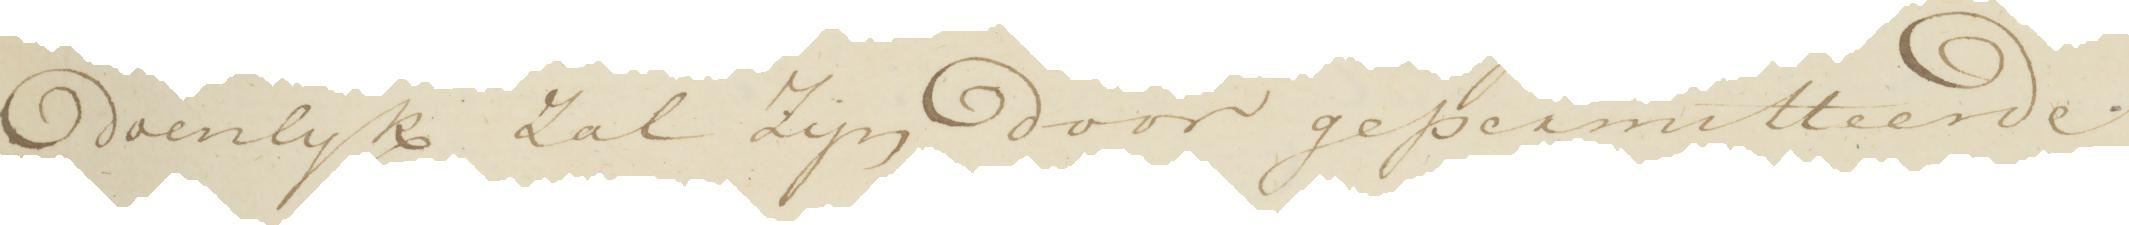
doenlyk zal zijn door gepermitteerde
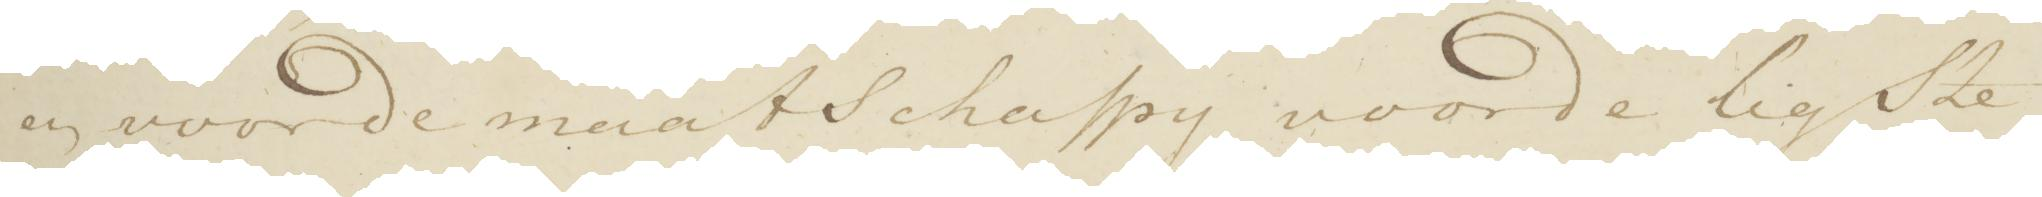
en voor de maatschappy voordeligste
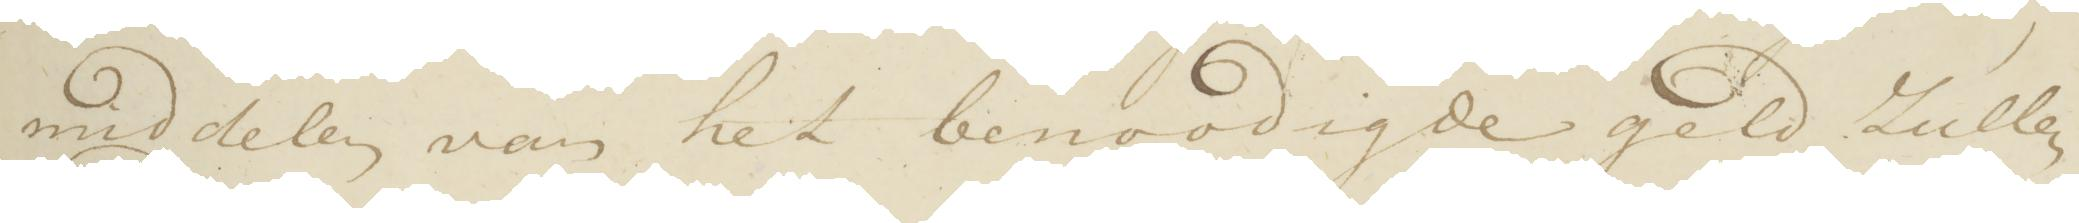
middelen van het benoodigde geld zullen
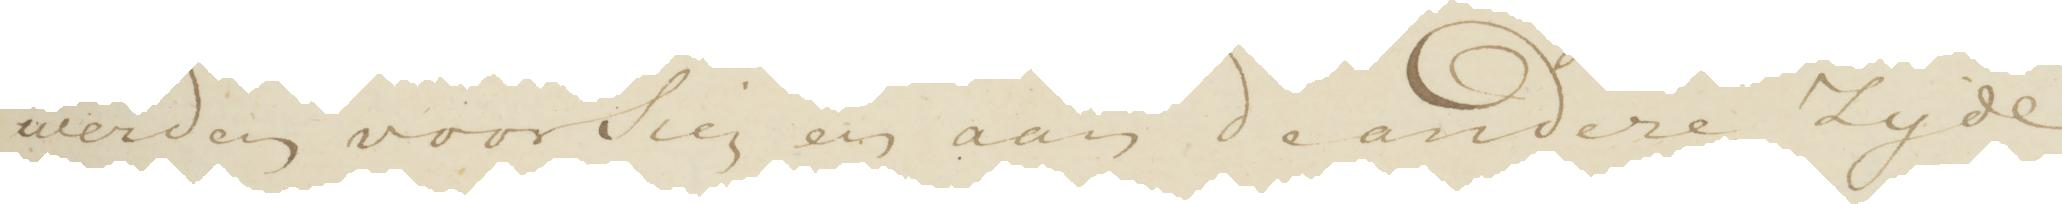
werden voorsien en aan de andere zyde
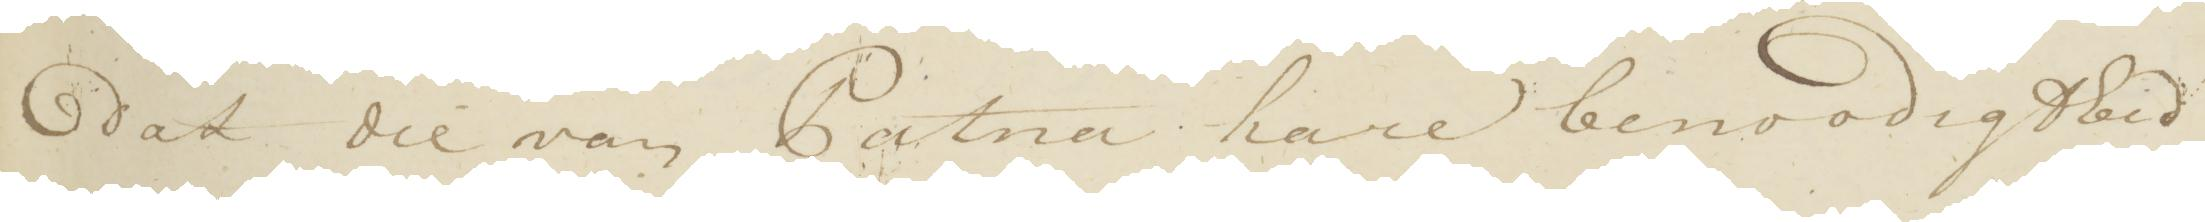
dat die van Patna hare benoodightheid
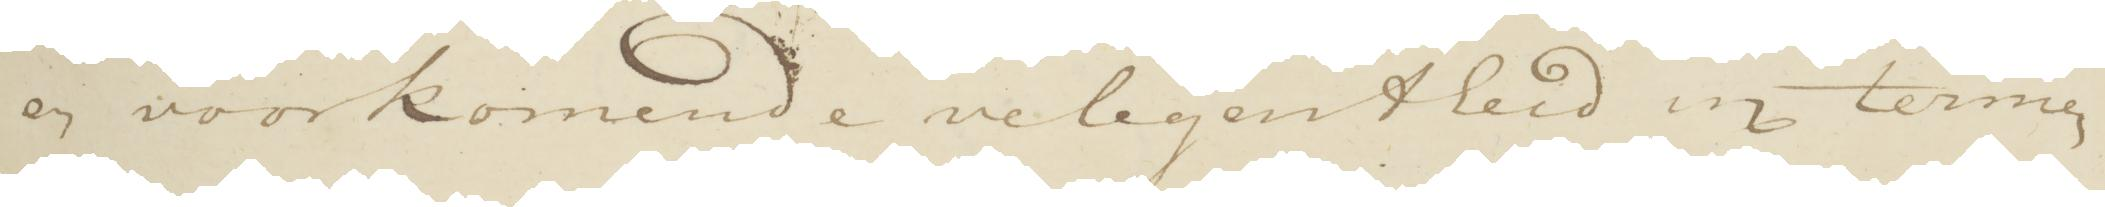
en voor komende velegentheid in termen
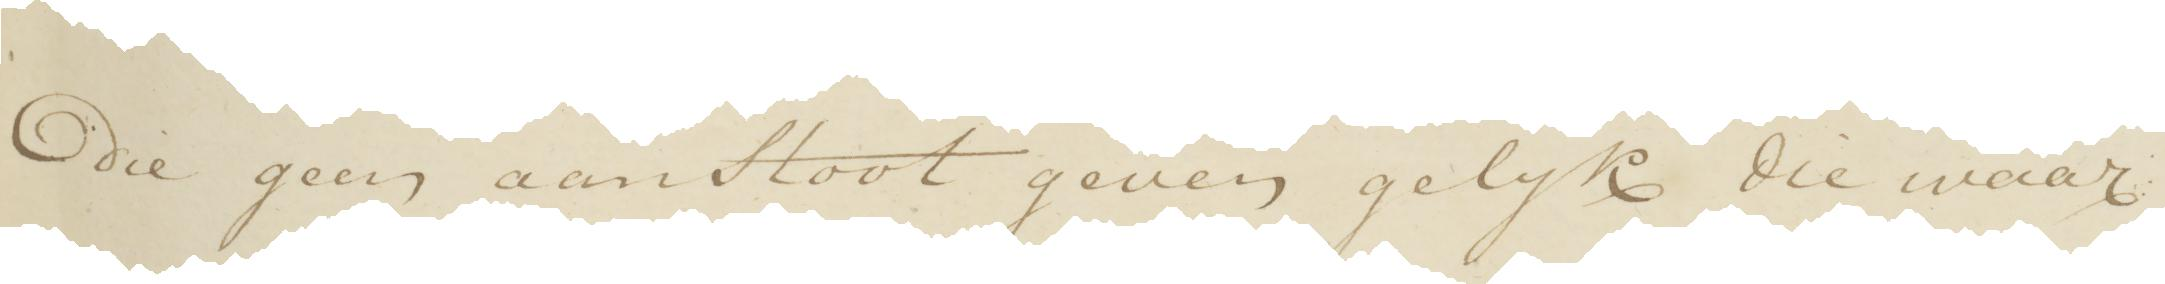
die geen aanstoot geven gelyk die waar
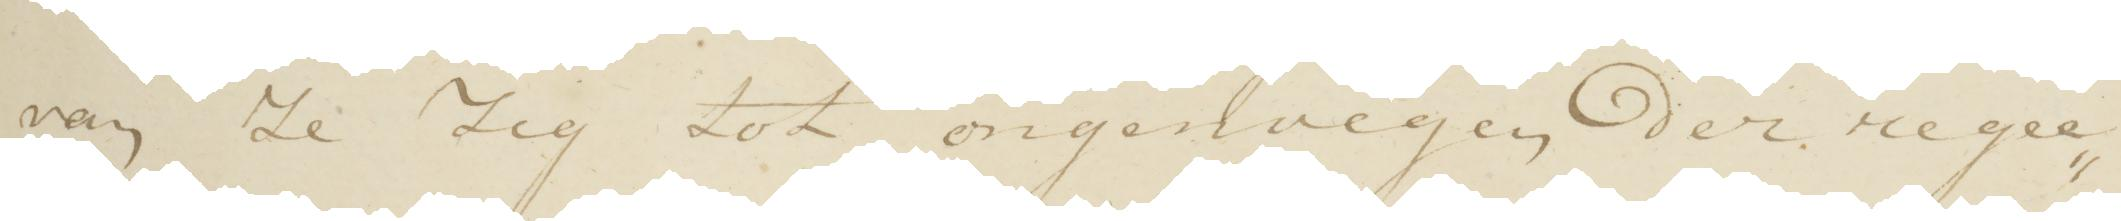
van ze zig tot ongenoegen der regee„
